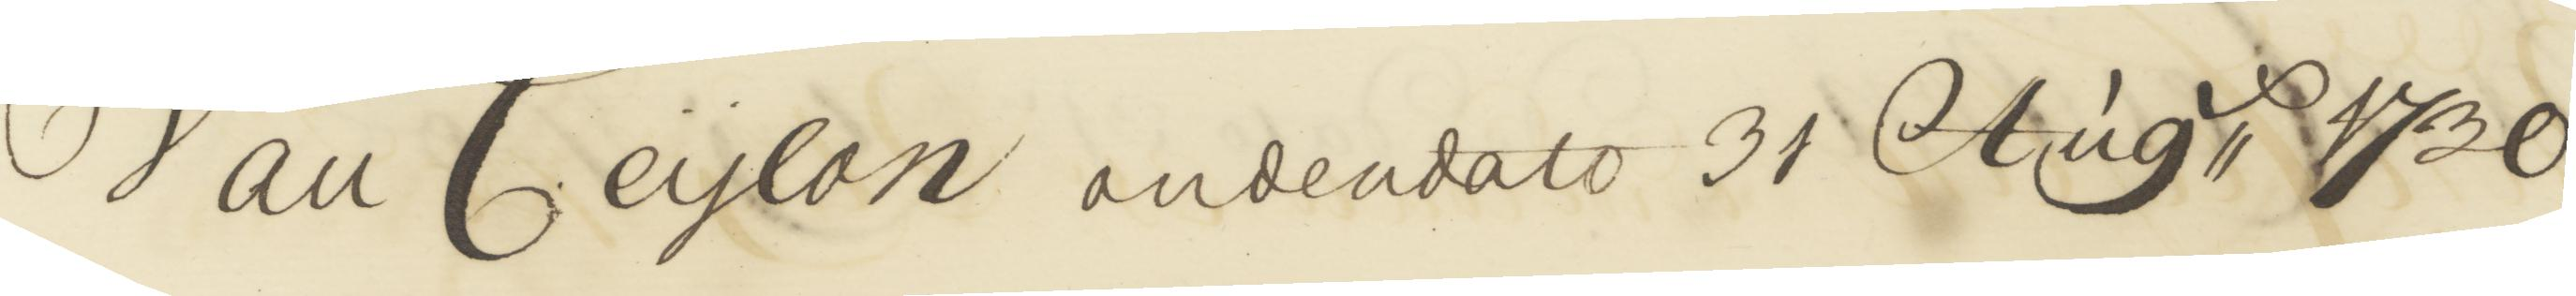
Van Ceijlon onder dato 31 Aug„s 1730
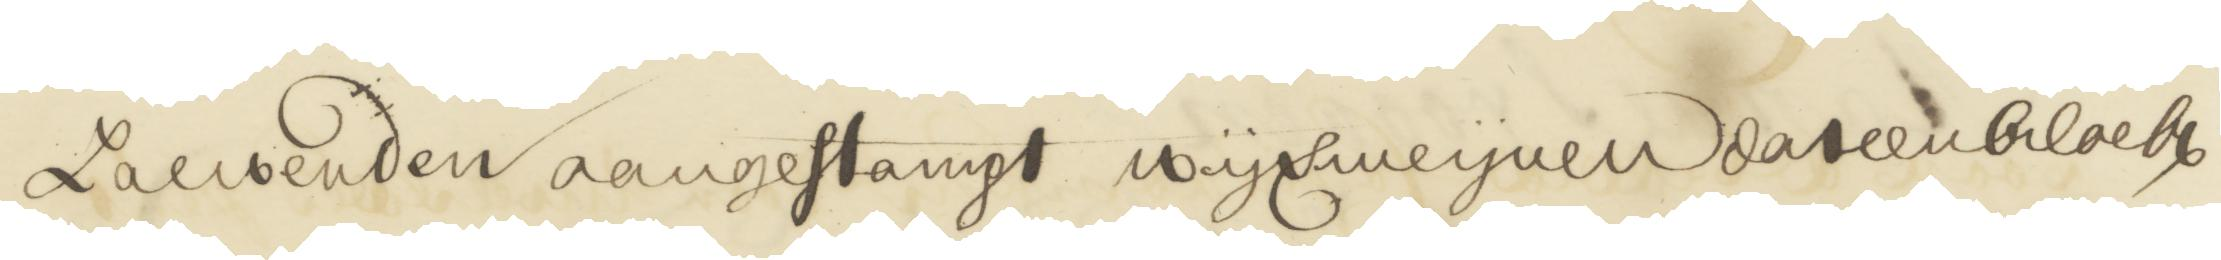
zal werden aangestampt wij vermeijnen dat een kloek
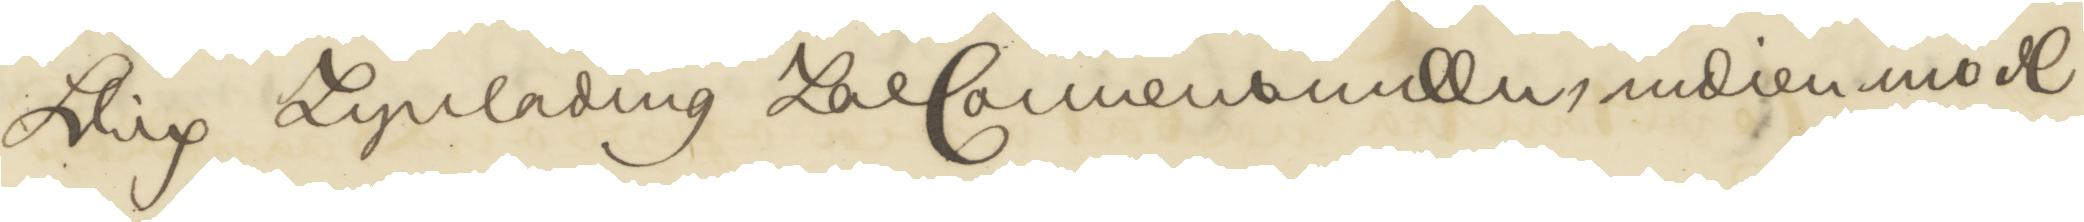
Schip Zyn lading Zal Connen vinden, indien u wel
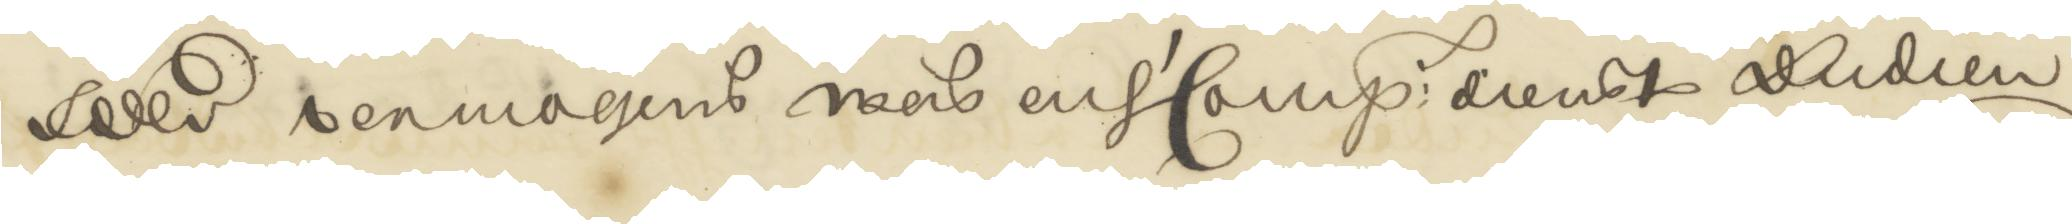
Edele vermogens was en s'Comp:s dienst ten dien
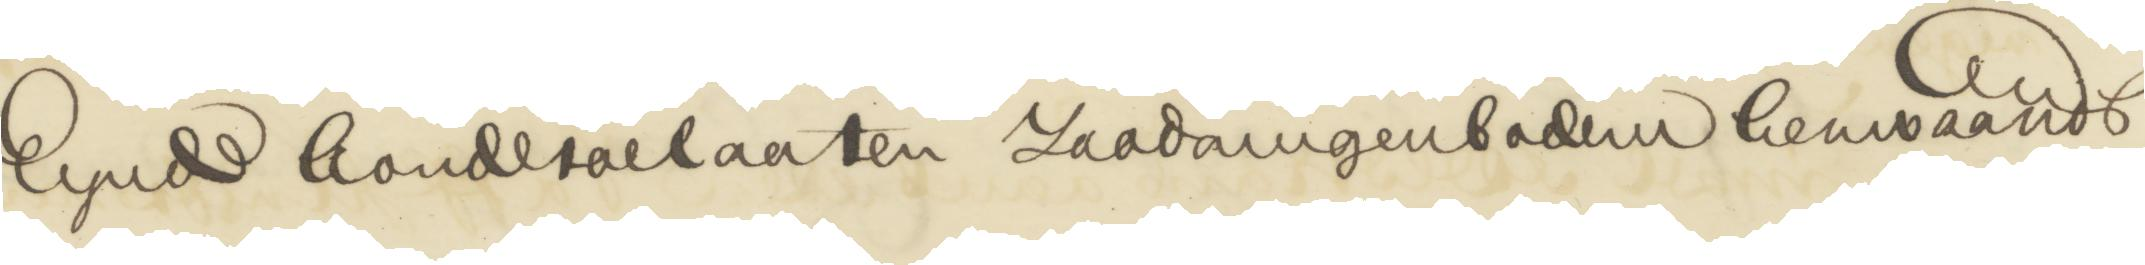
Eynde konde toelaaten Zoodanigen bodem herwaards
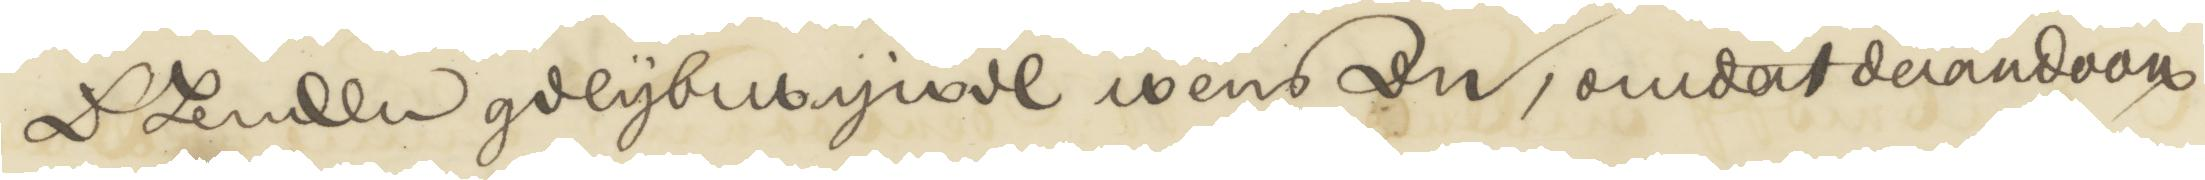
te Zenden gelijk wijwel wensten, omdat daardoor
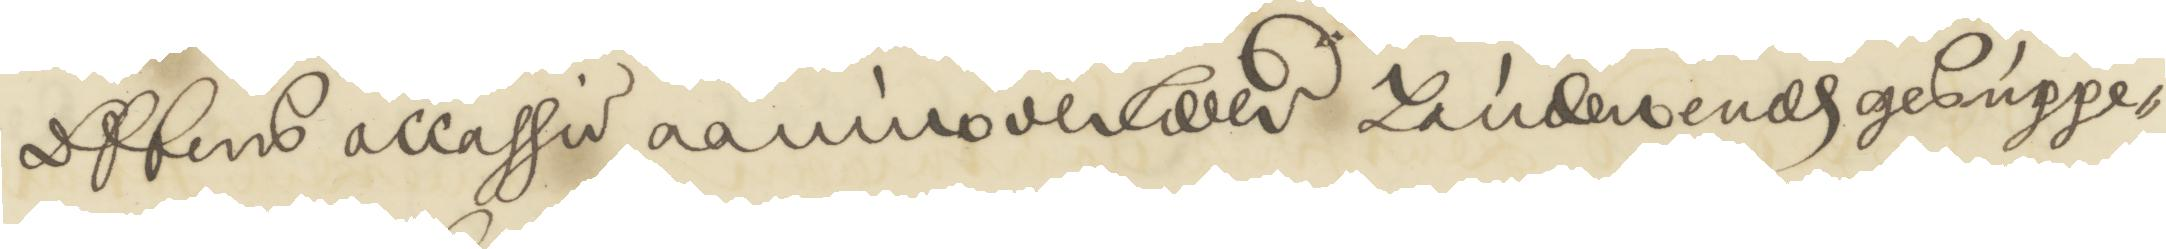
teffens occassie aan uwel Edele Zoude werden gesuppe„
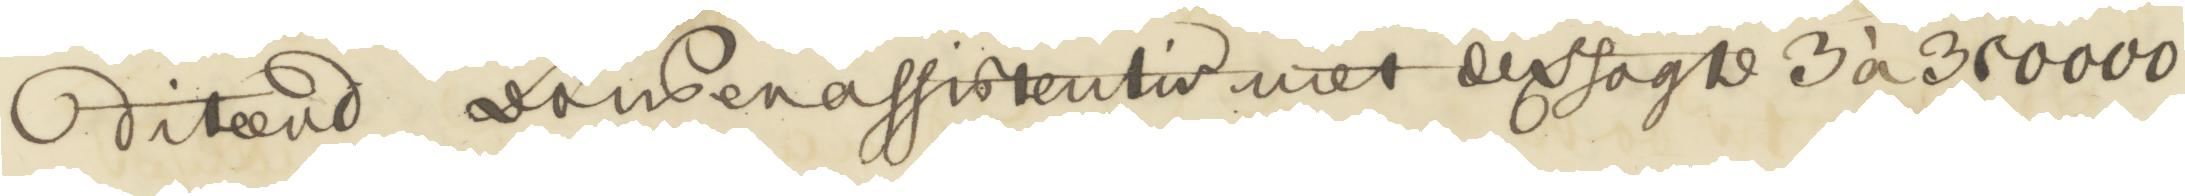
diteerd te onser assistentie met de versogte 3 à 350000
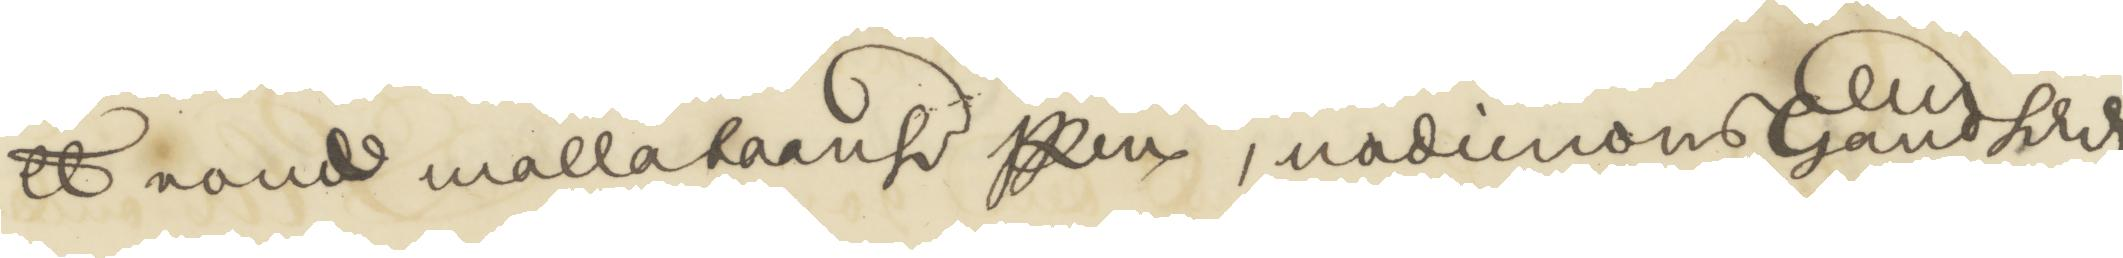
lb ronde mallabaarse peper, nadien ons Gandschen
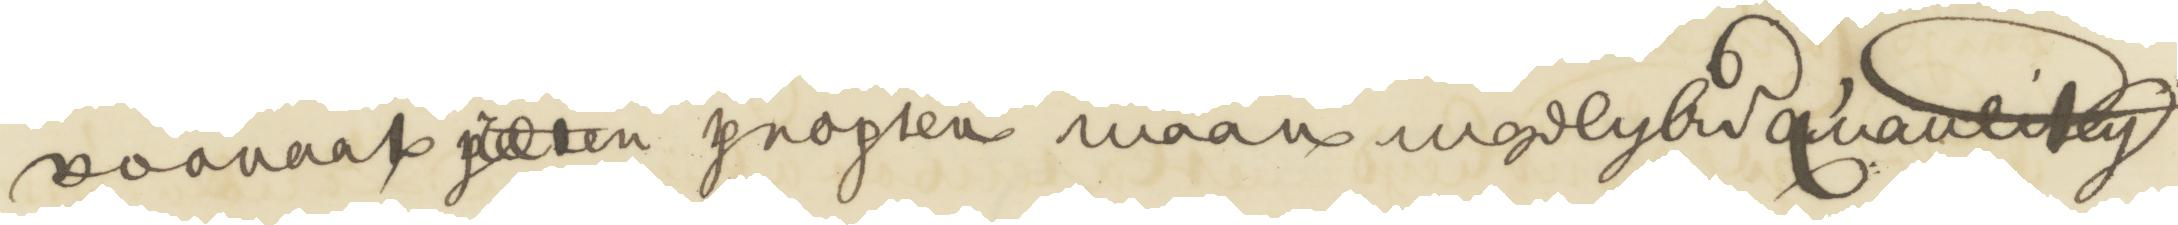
vooraat peper propter maar ingelyke quanlitey
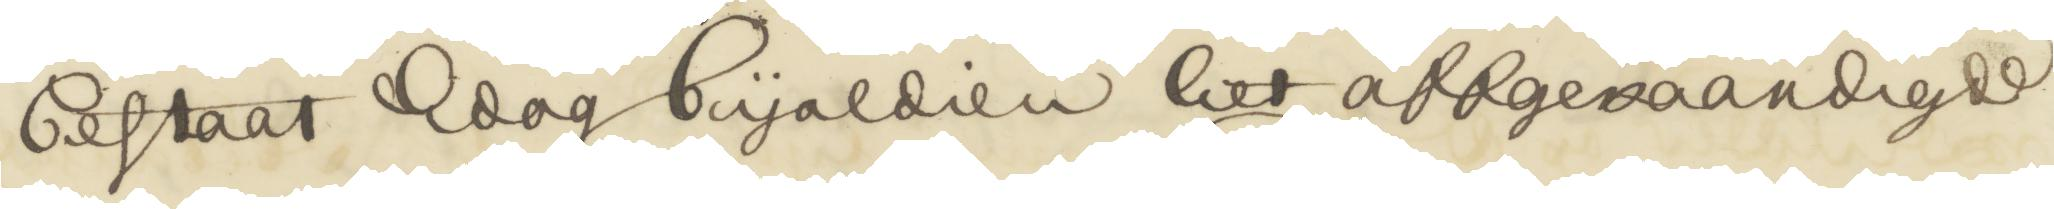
bestaat Edog bij aldien het affgevaardigde
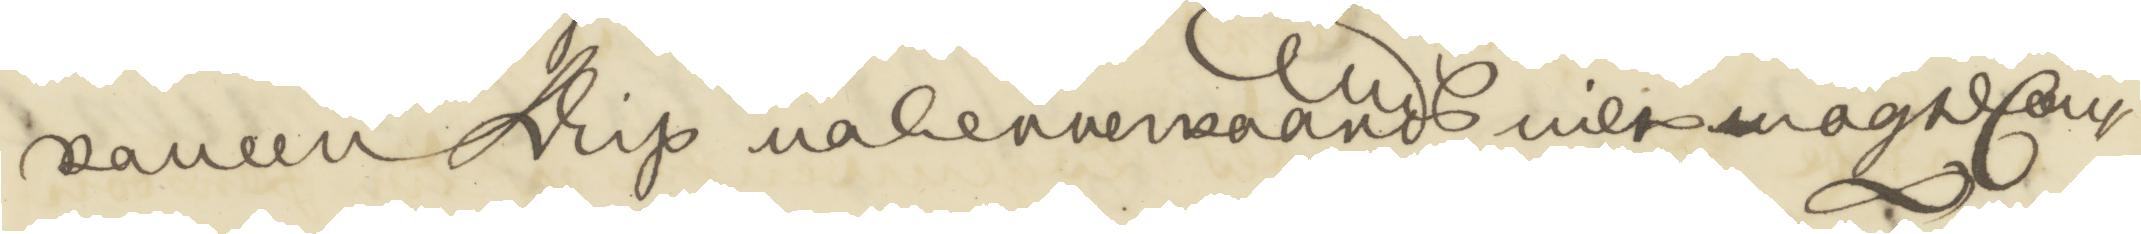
van een schip na herrewaards niet mogte Con
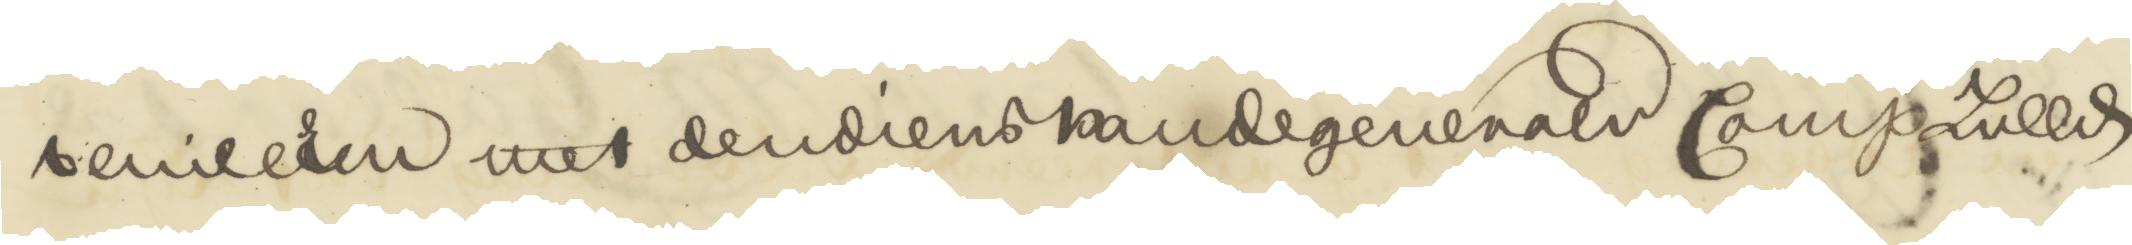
venieeren met den diens vande generale Comp Zullen
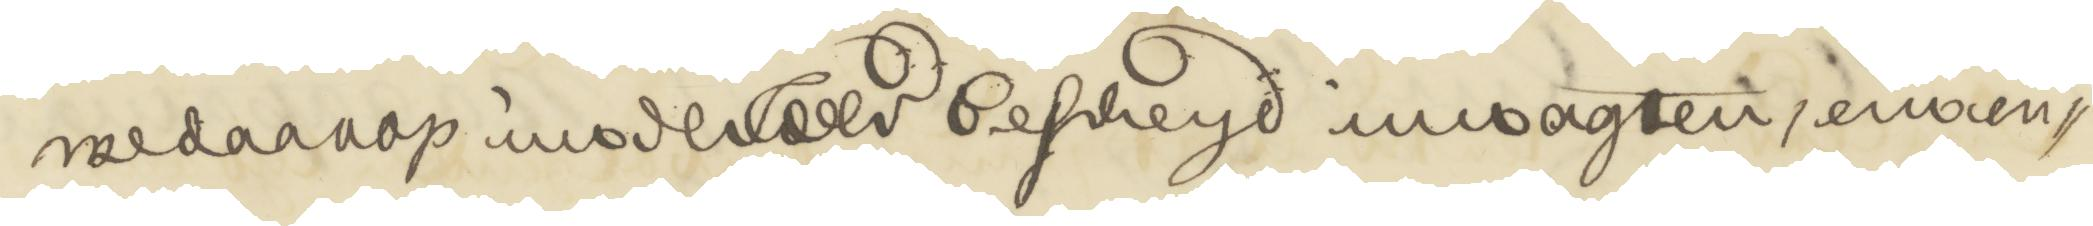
we daarop uwel Edele bescheyd inwagten, enver„
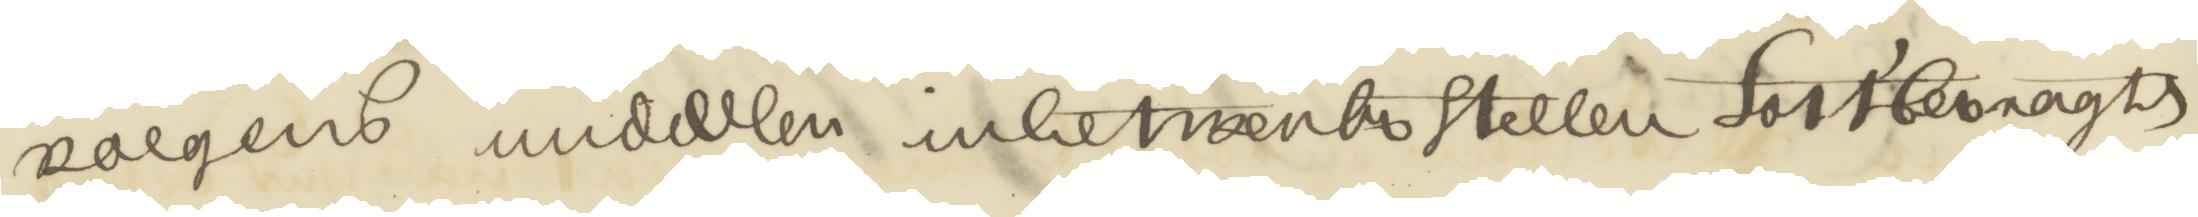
volgens middelen in het werk stellen tot t' bevragten
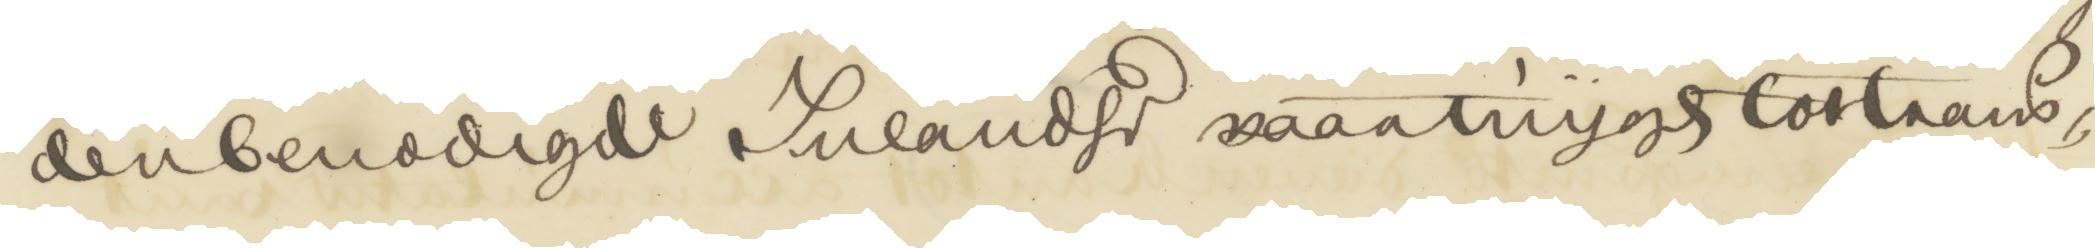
der benodigde Inlandse vaartuijgen tot trans„
